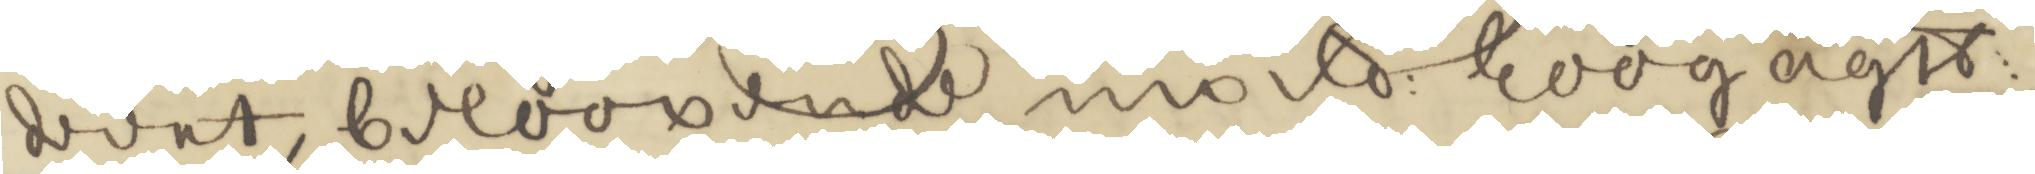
deert, beloovende uw Ed: hoog agtb:
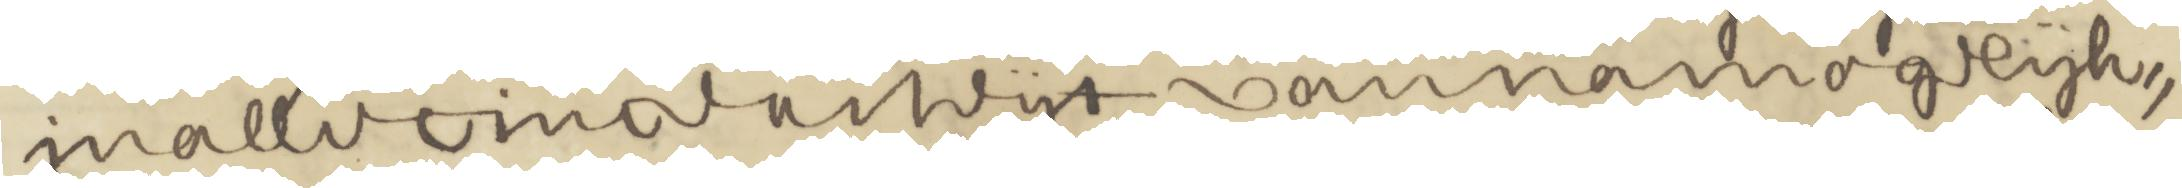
in alle cinceriteijt van na mogelijk„
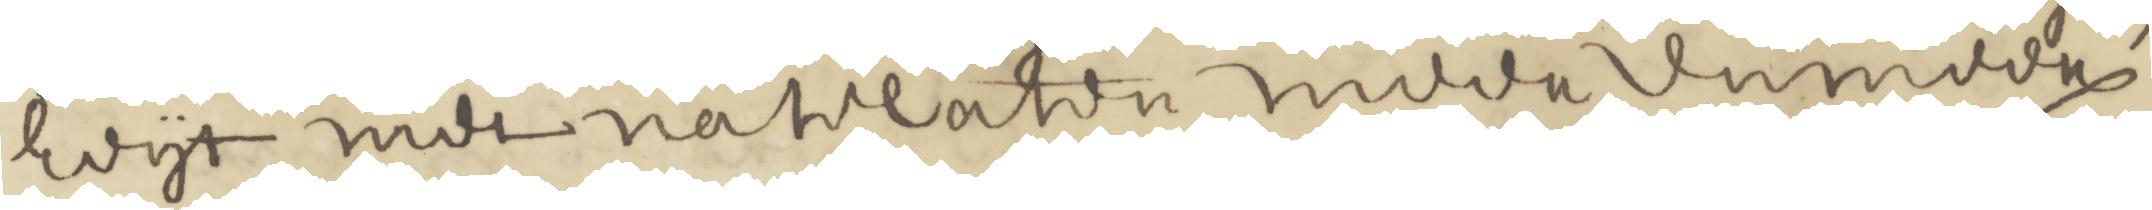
heijt niet natelaten meer en meer
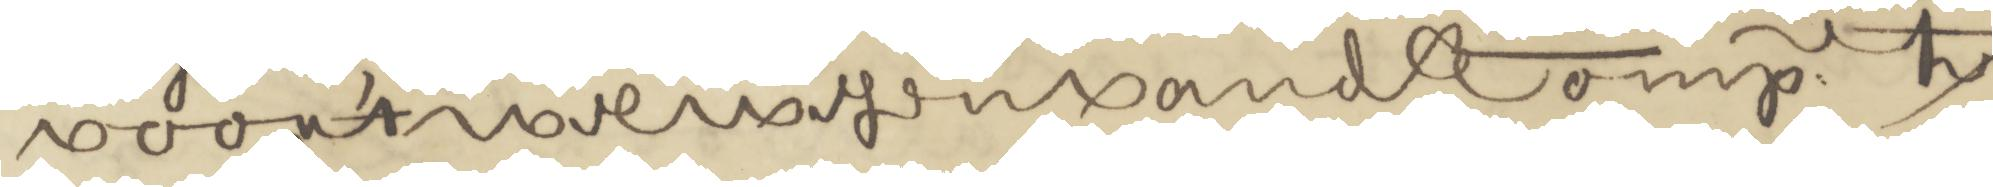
voor't welwesen van dEComp:e te
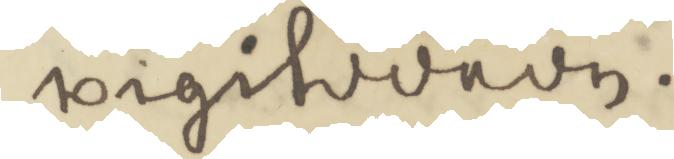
vigileeren.
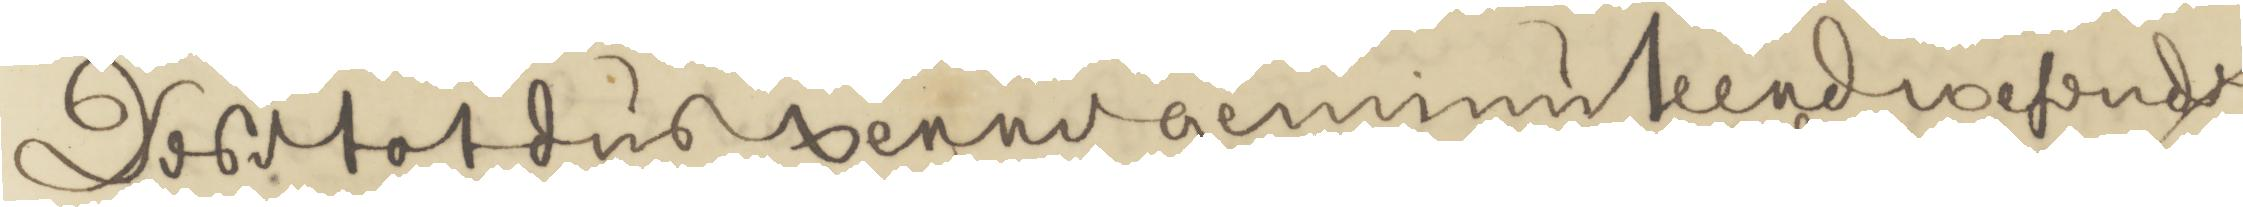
Dese tot dus verre geminuteerd wesende
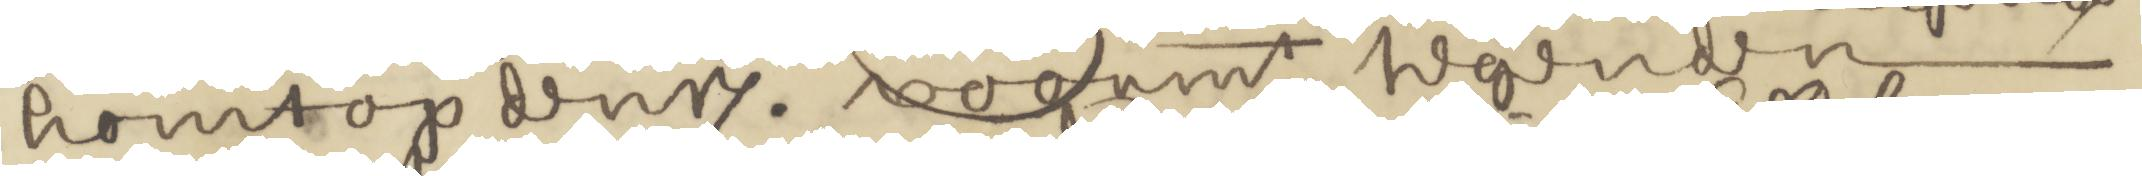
komt op den 17. voorm:t tegenden
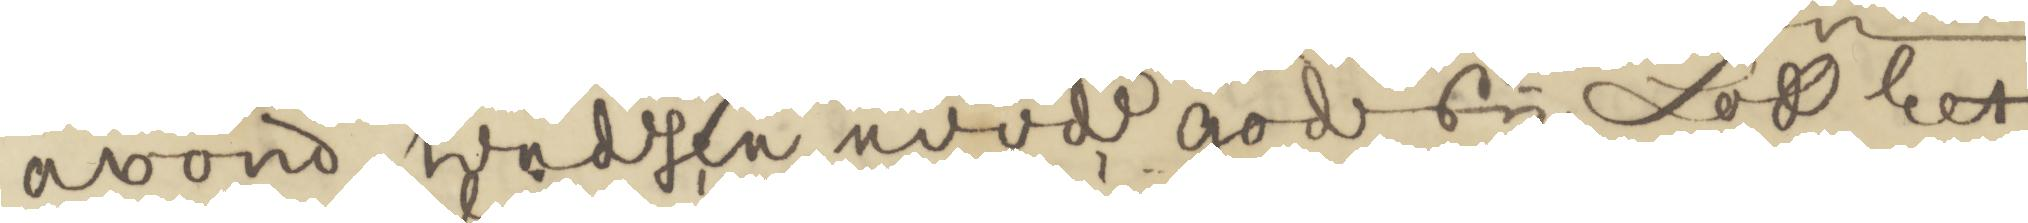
avond ter deser reede gode sij Lof het
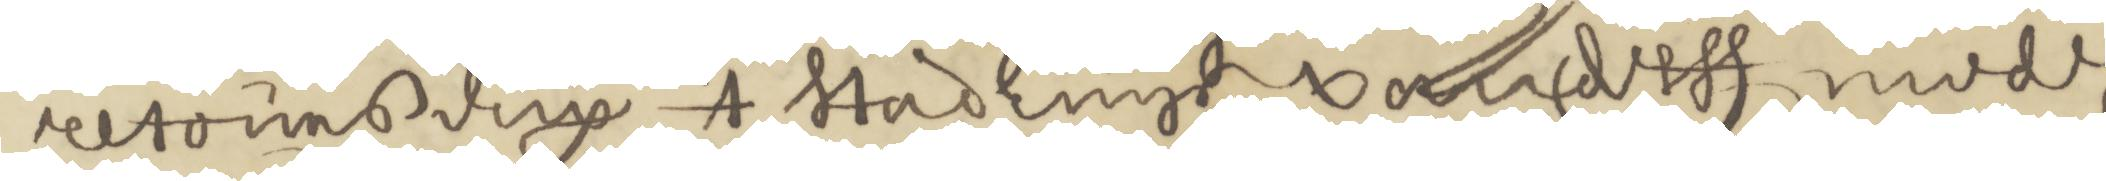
retourschip 't stadhuijs van delff mede
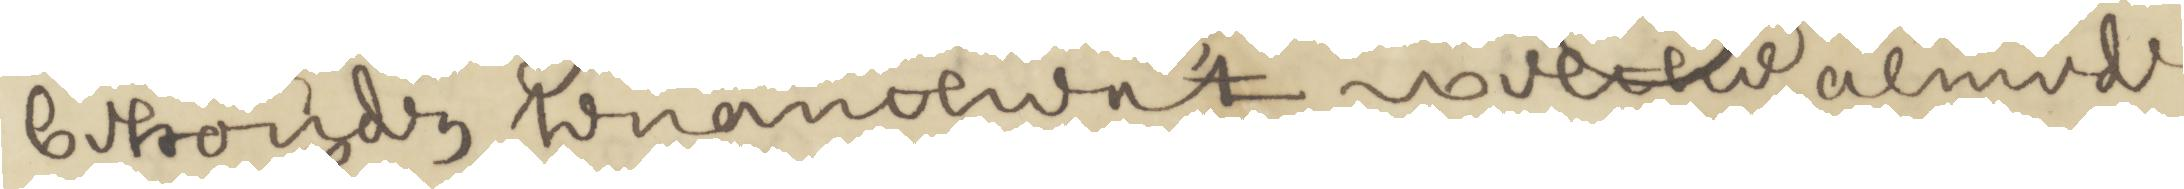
behouden tenancker 't welcke almede
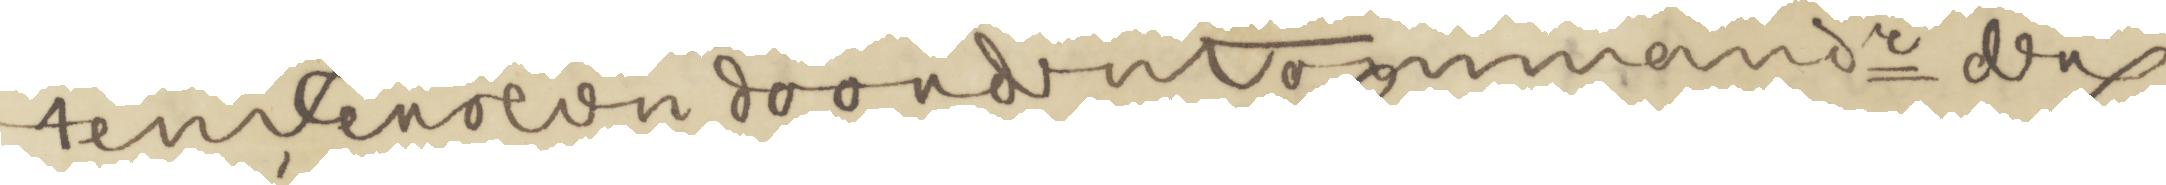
ten Eersten door den Command=r der
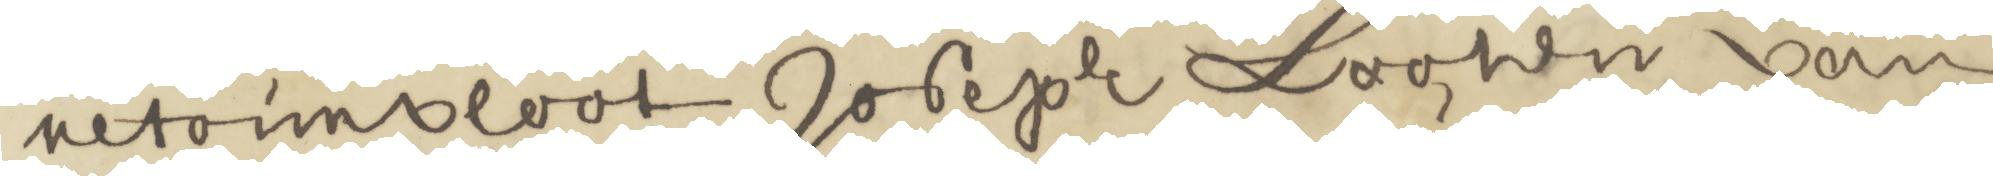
retourvloot Joseph Looten van
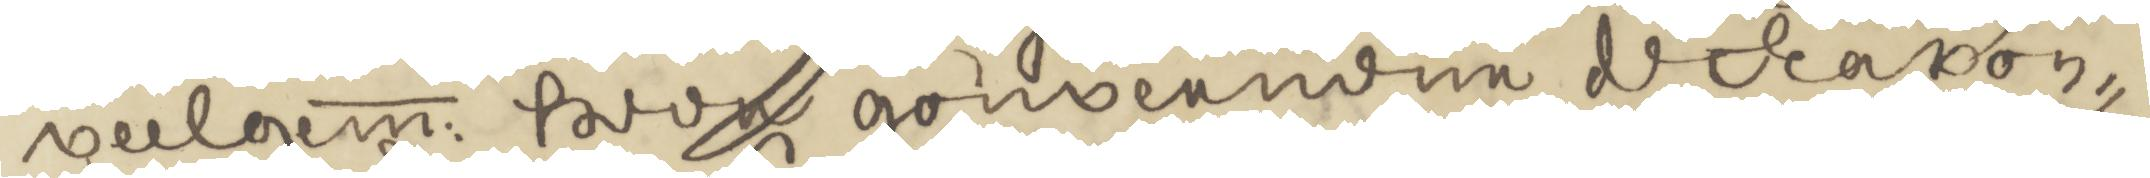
veel gem: heer gouverneur de chavon„
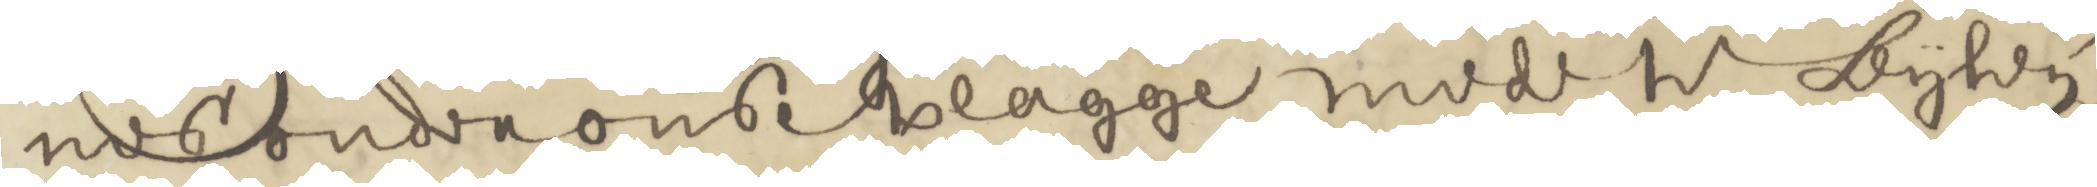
nes onder ons vlagge mede te seijlen
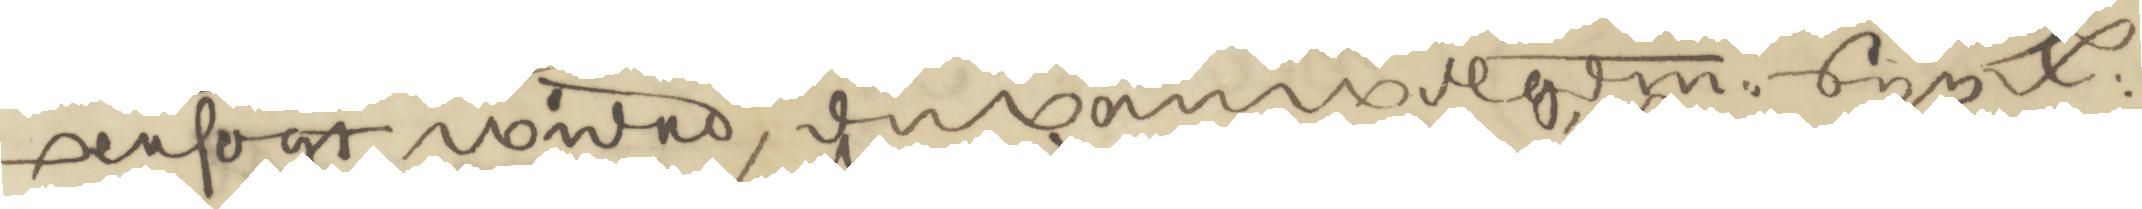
versogt wierd, en van wel gem: sijn E:
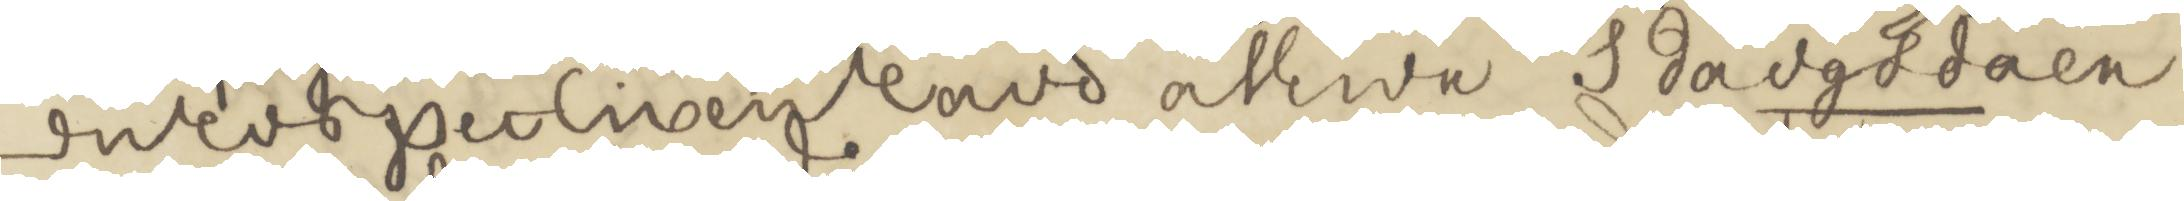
en respectiven raed alhier 's daegs daer
